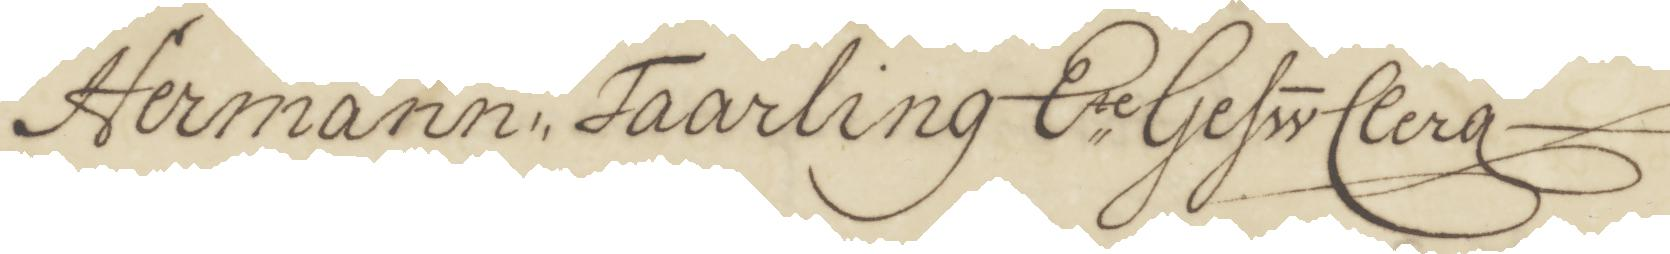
Hermann„s Taarling E„te Gesw Clerq —
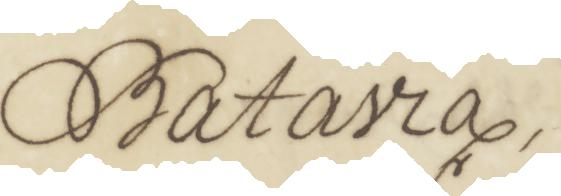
Batavia,
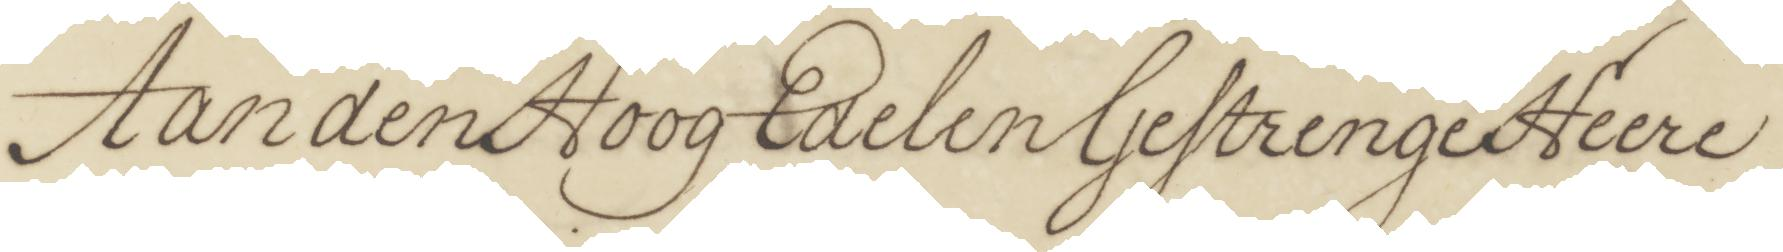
Aan den Hoog Edelen Gestrenge Heere
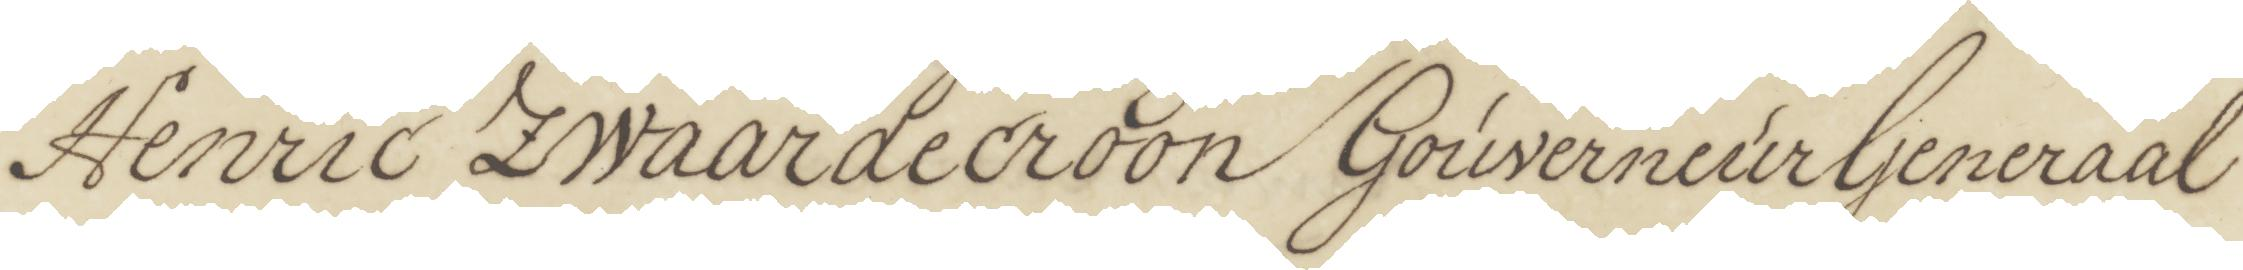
Henric Zwaardecroon Gouverneur Generaal
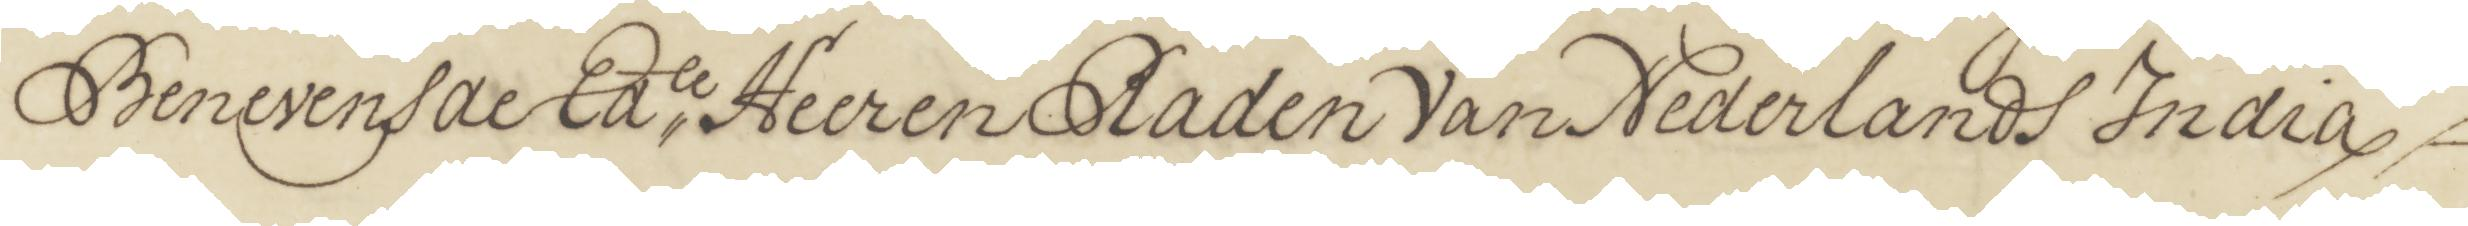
Benevens de Ed„le Heeren Raden Van Nederlands India —
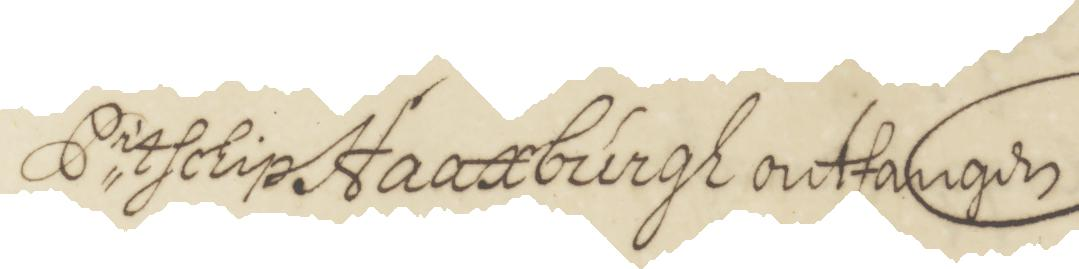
P„r 't schip Haaxburgh ontfangen
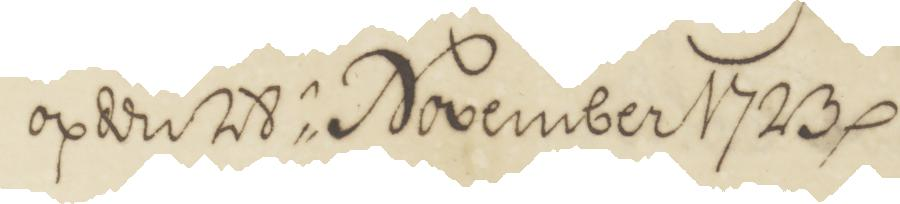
op den 28„' November 1723 —
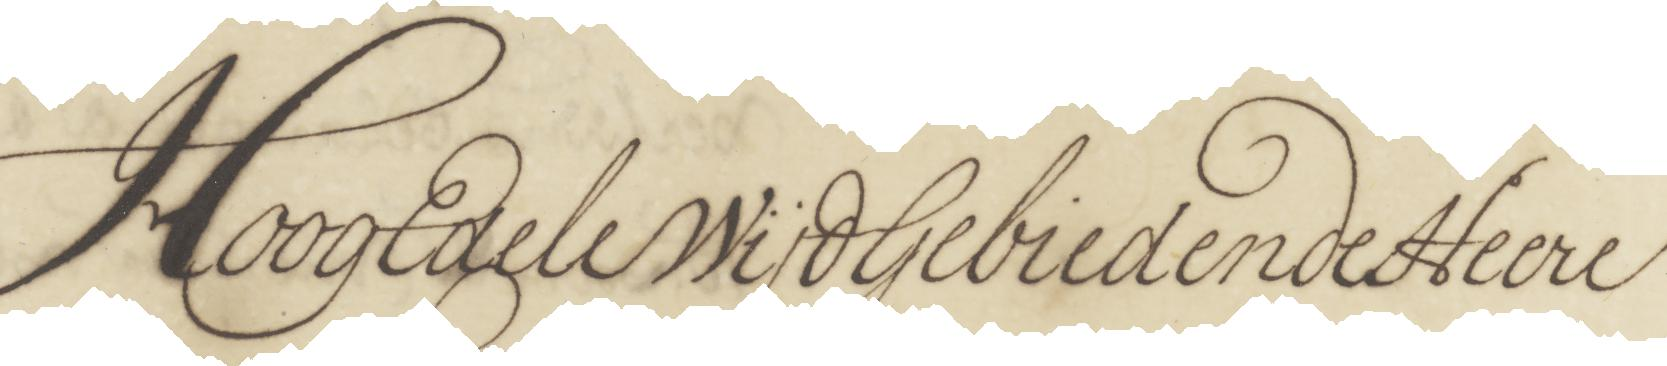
Hoog Edele wijd Gebiedende Heere
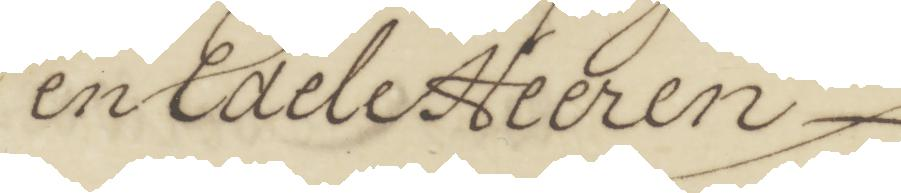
en Edele Heeren —
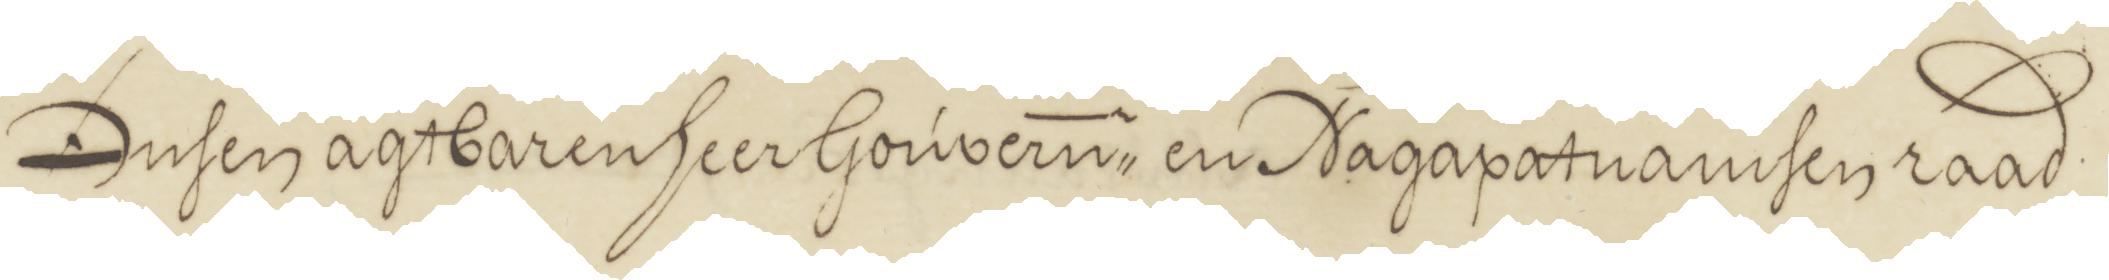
Onsen agtbaren heer Gouvern„ en Nagapatnamsen raad
